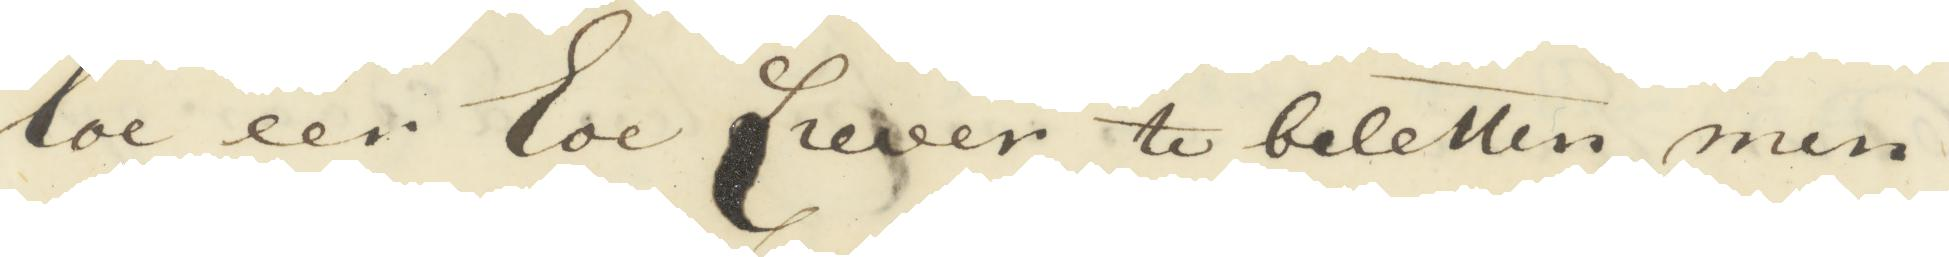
hoe eer hoe Liever te beletten, men
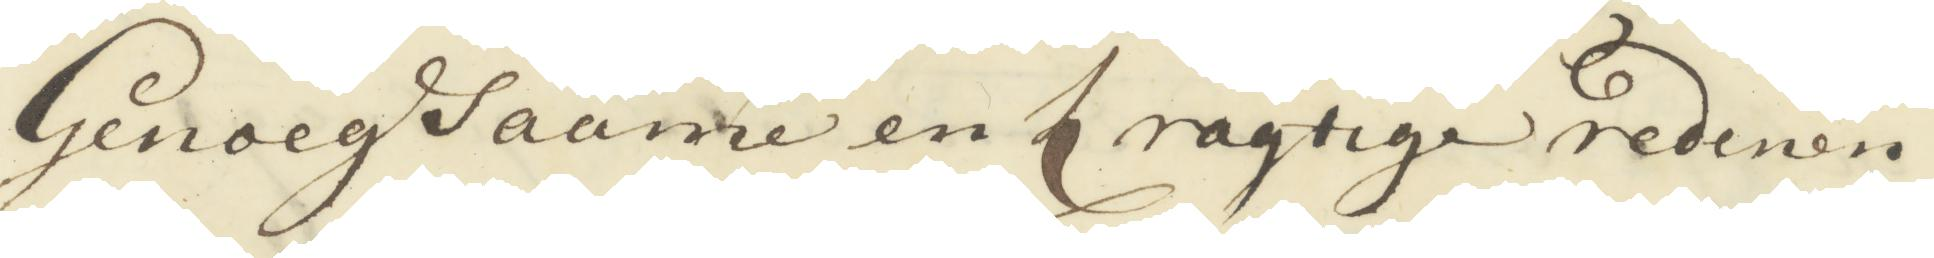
Genoegsaame en kragtige redenen
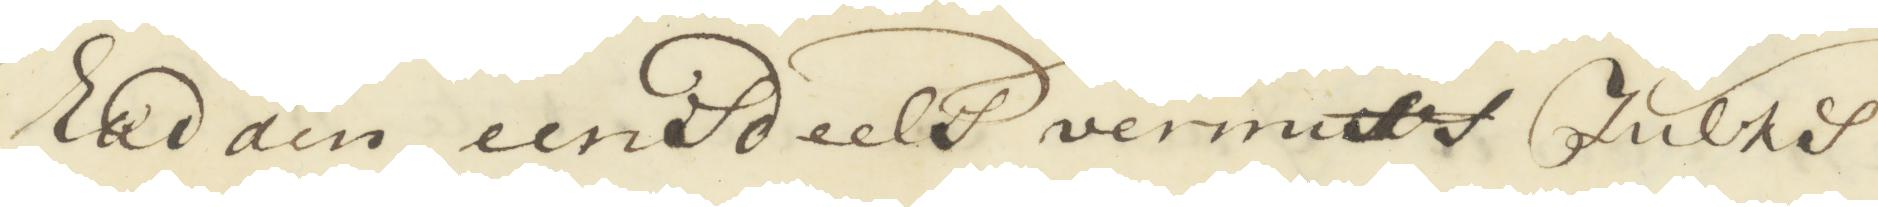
had den, eensdeels vermits zulks
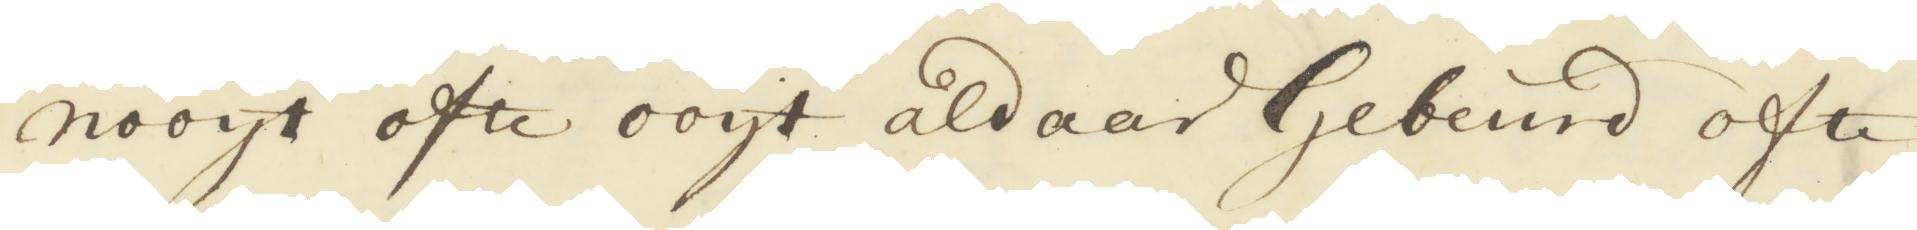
nooijt ofte ooijt aldaar Gebeurd ofte
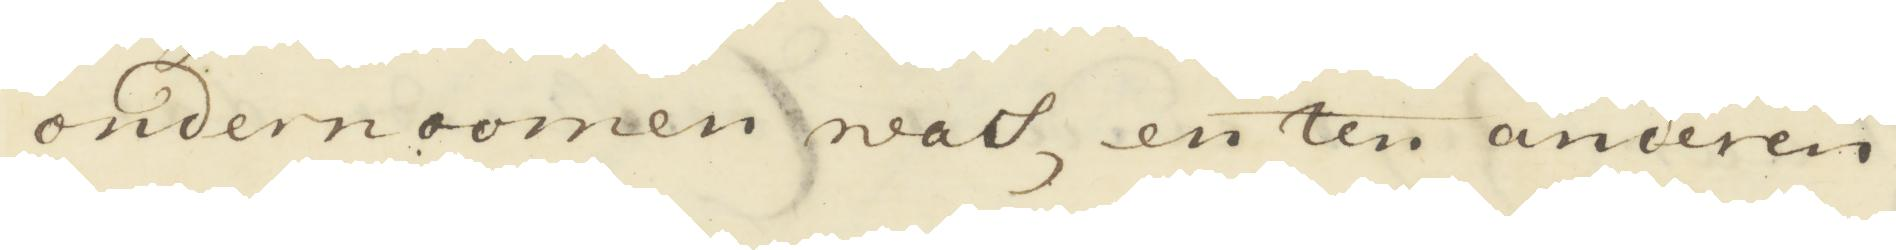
ondernoomen was, en ten anderen
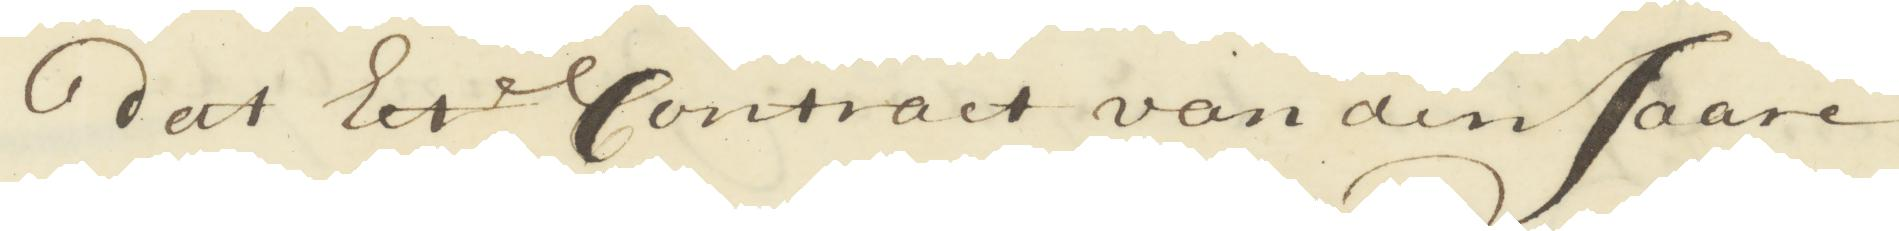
dat het Contract van den Jaare
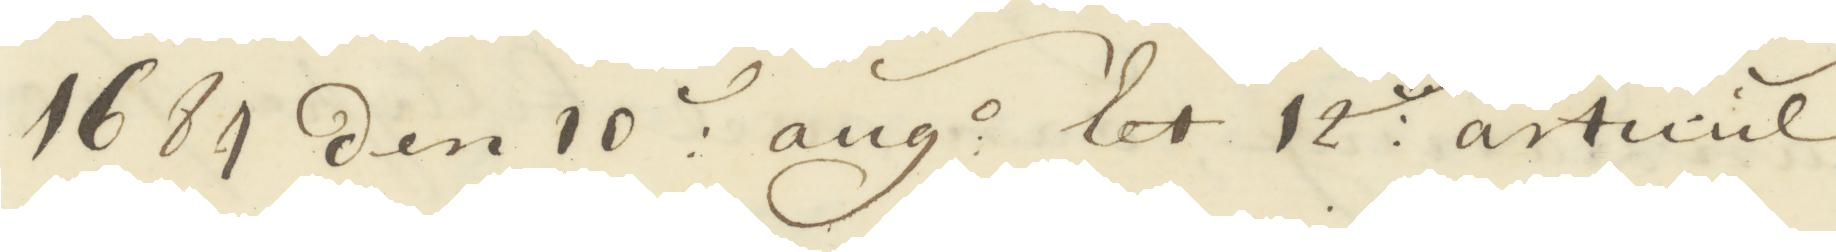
1684 den 10:e aug:o het 12:e articul
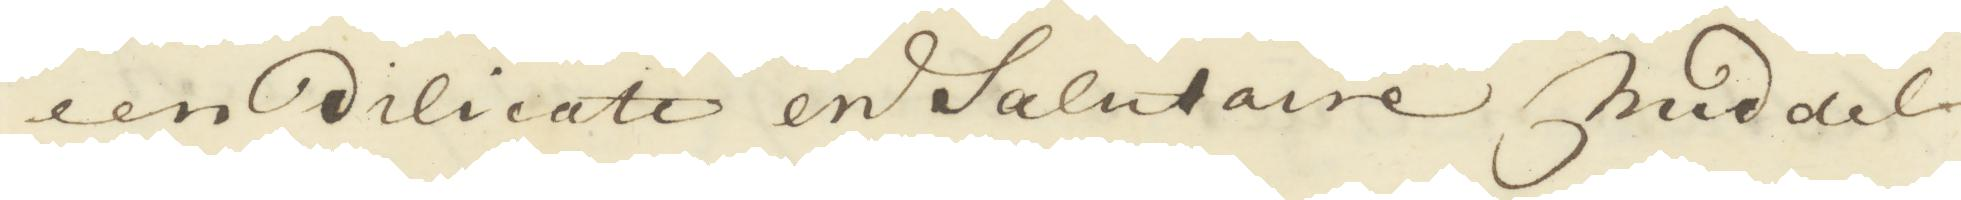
een dilicate en salutaire middel
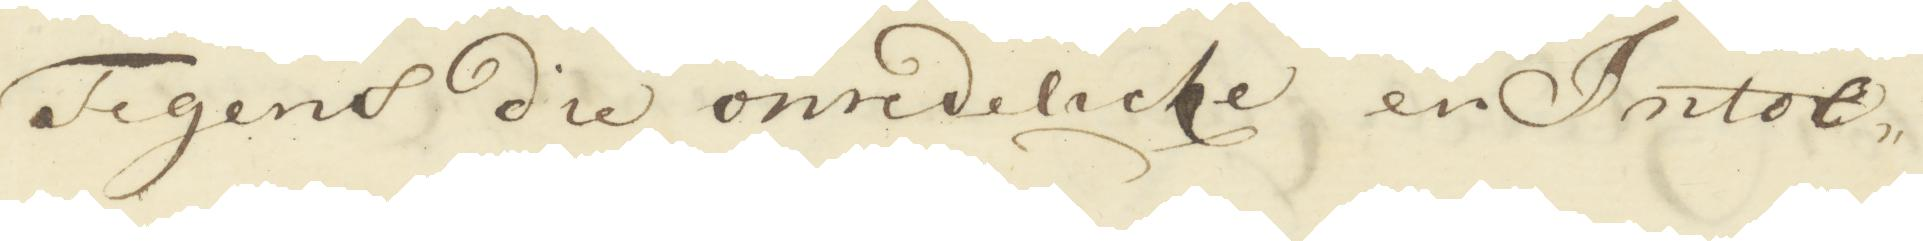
Tegens die onredelicke en Intol„
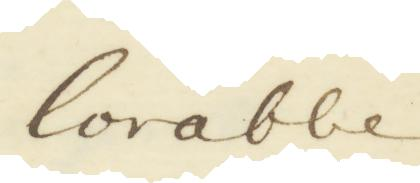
lorable
